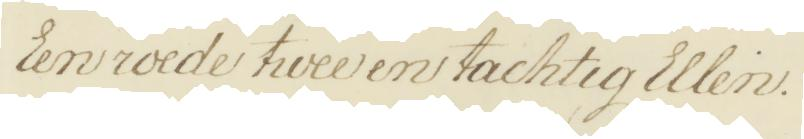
Een roede twee en tachtig Ellen.
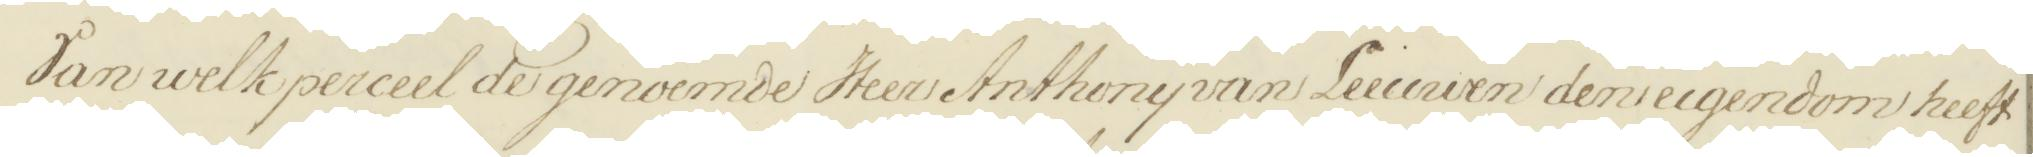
Van welk perceel de genoemde Heer Anthony van Leeuwen den eigendom heeft
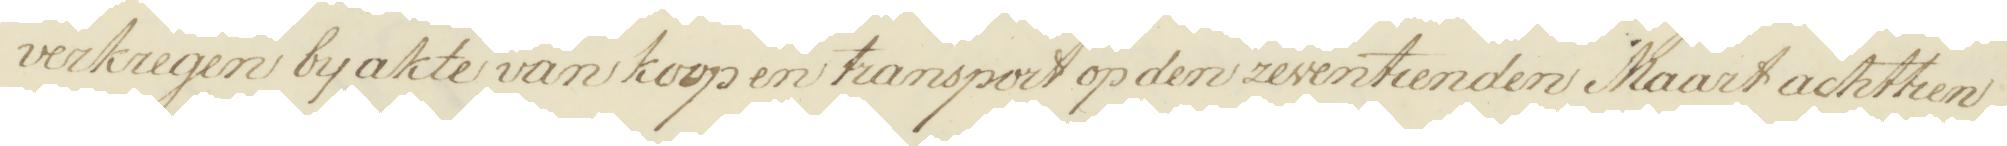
verkregen by akte van koop en transport op den zeventienden Maart achttien
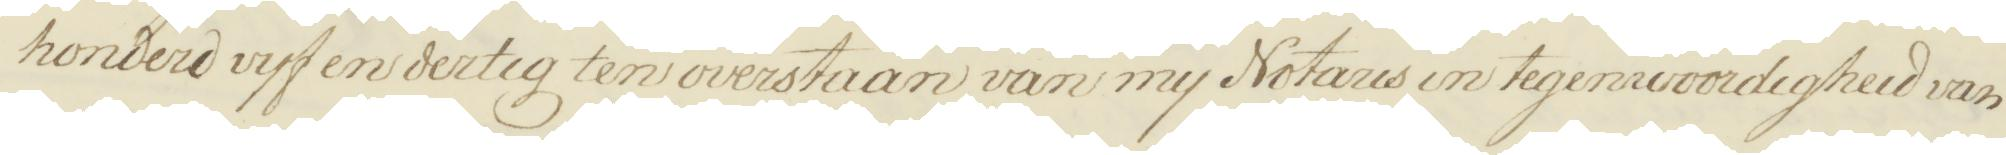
honderd vyf en dertig ten overstaan van my Notaris in tegenwoordigheid van
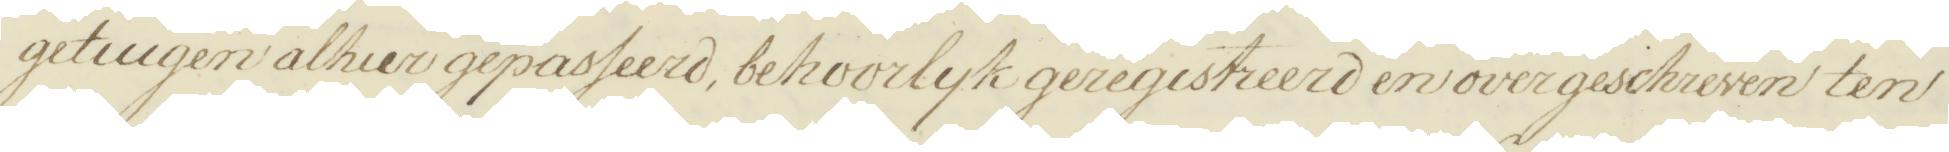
getuigen alhier gepasseerd, behoorlyk geregistreerd en overgeschreven ten
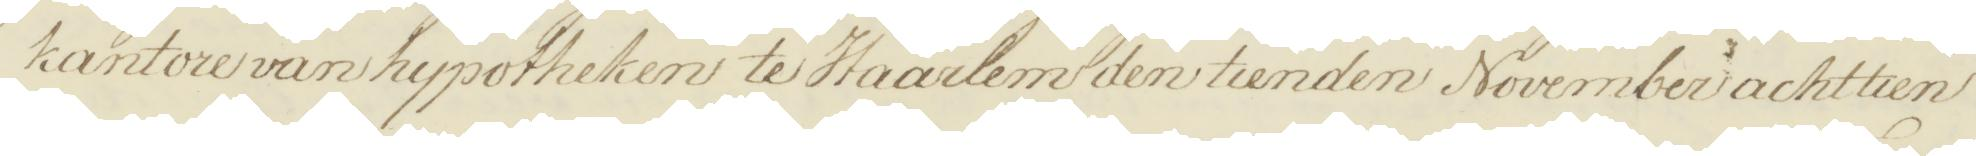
kantore van hypotheken te Haarlem den tienden November achttien
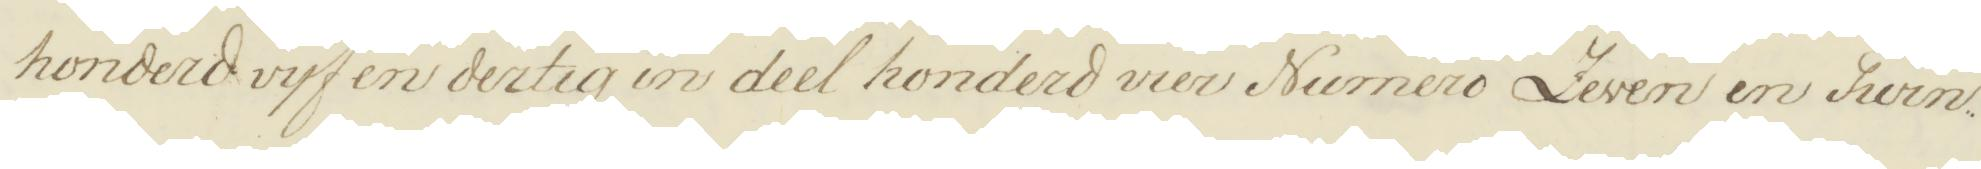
honderd vyf en dertig in deel honderd vier Numero Zeven en Twin„
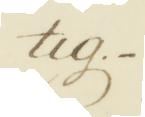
tig.-
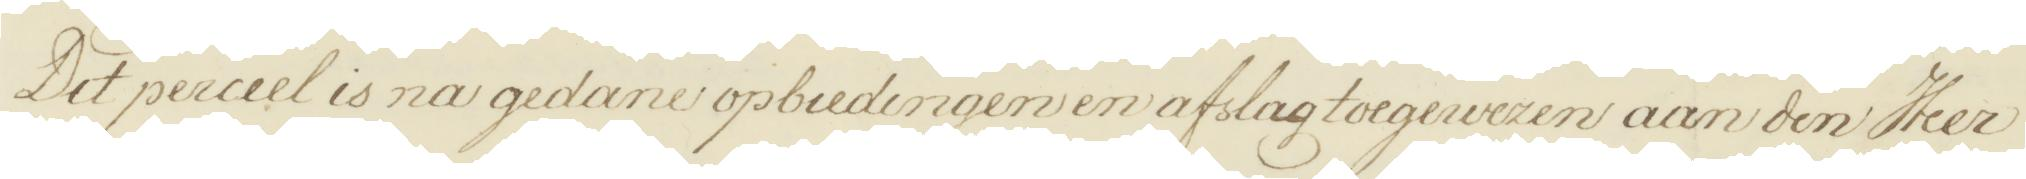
Dit perceel is na gedane opbiedingen en afslag toegewezen aan den Heer
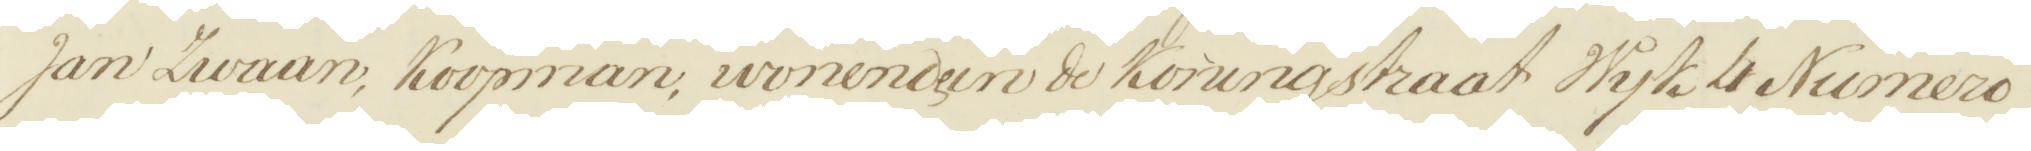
Jan Zwaan, koopman, wonende in de Koningstraat Wyk 4 Numero
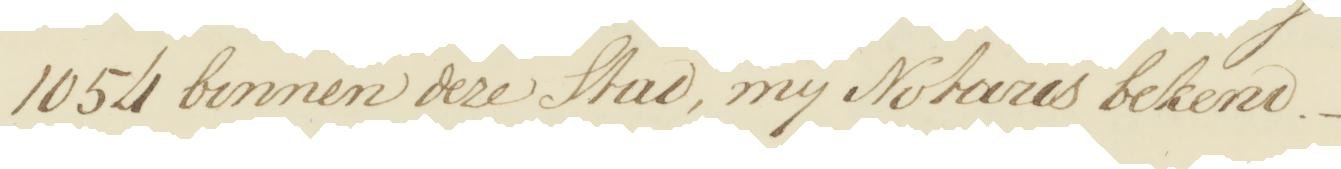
1054 binnen deze stad, my Notaris bekend.
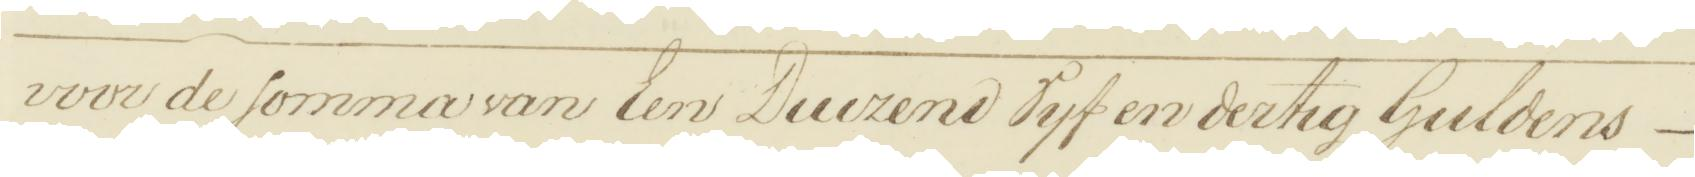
voor de Somma van Een Duizend vyf en dertig Guldens-
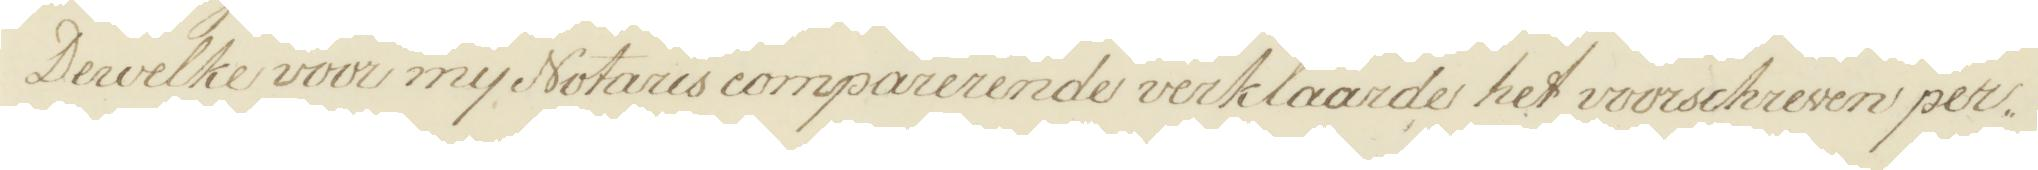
Dewelke voor my Notaris comparerende verklaarde het voorschreven per„
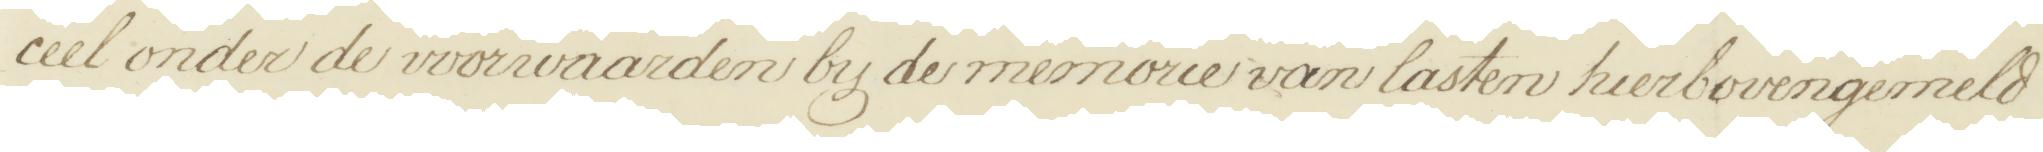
ceel onder de voorwaarden by de memorie van lasten hierboven gemeld
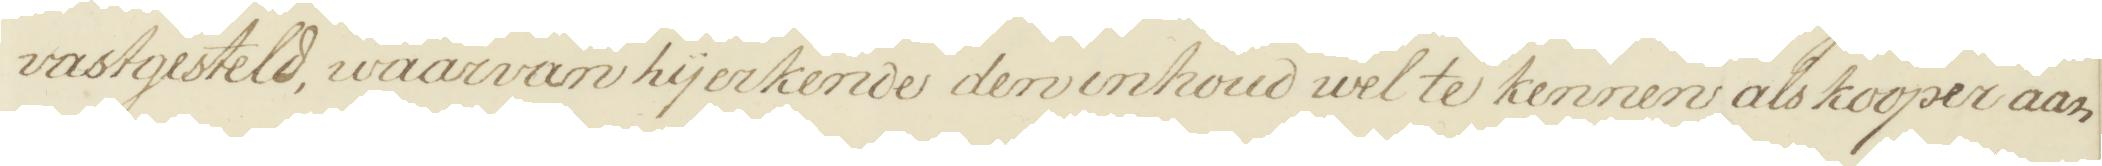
vastgesteld, waarvan hij erkende den inhoud wel te kennen als kooper aan
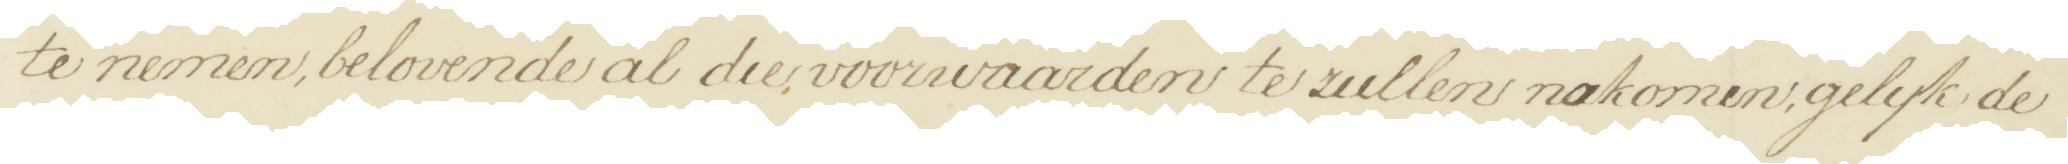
te nemen, belovende al die, voorwaarden te zullen nakomen, gelyk de
